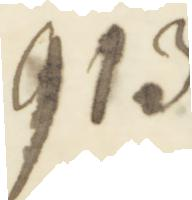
913
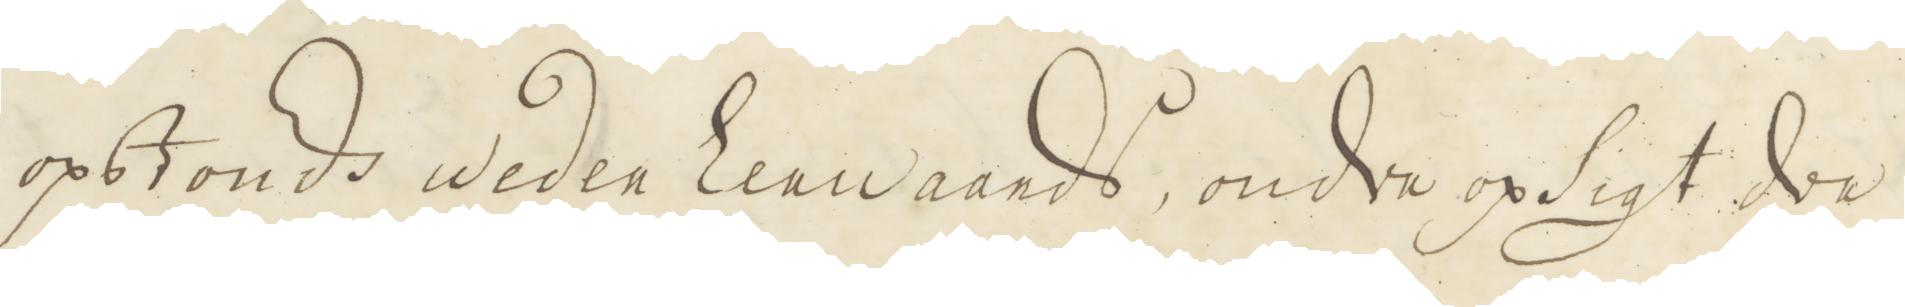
opstond weder herwaards, onder opsigt der
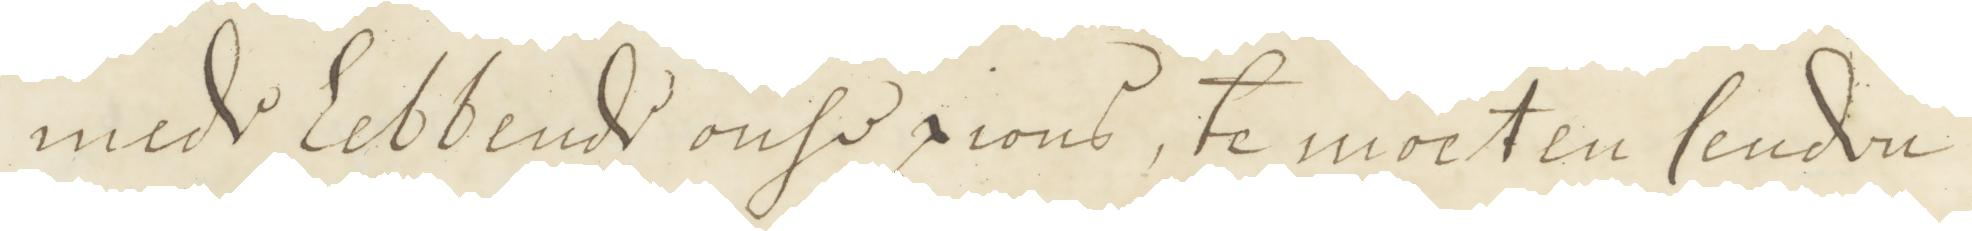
mede hebbende onse pions, te moeten senden
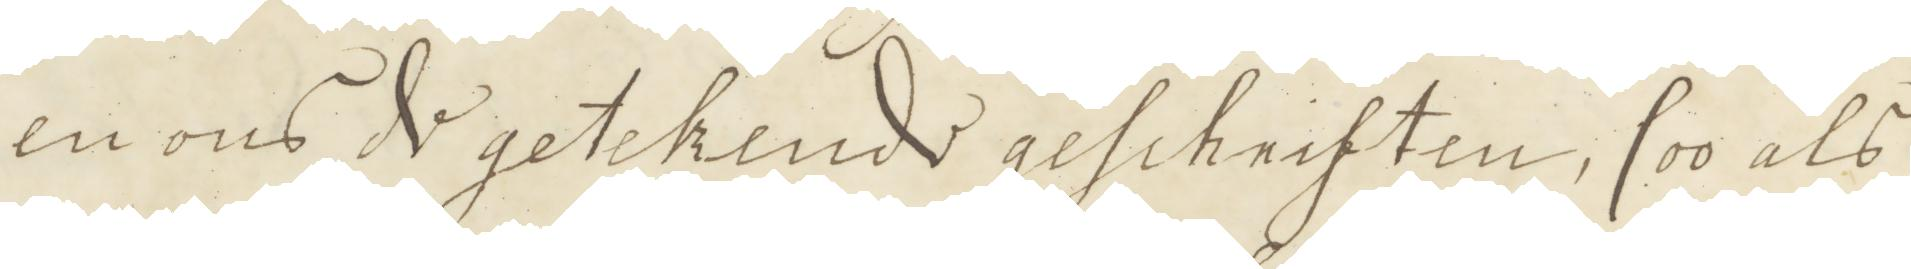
en ons de getekende geschriften, soo als
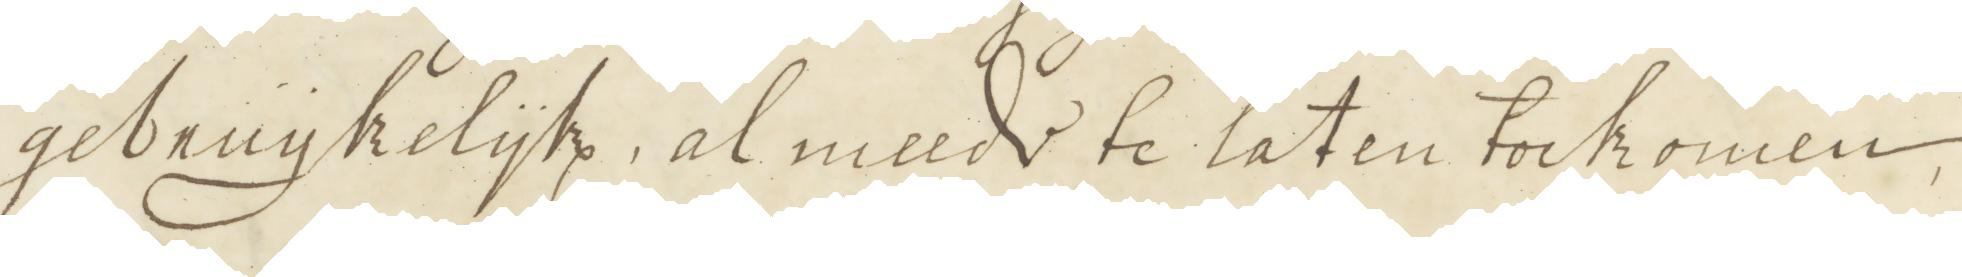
gebruijkelijk, al meede te laten toekomen,
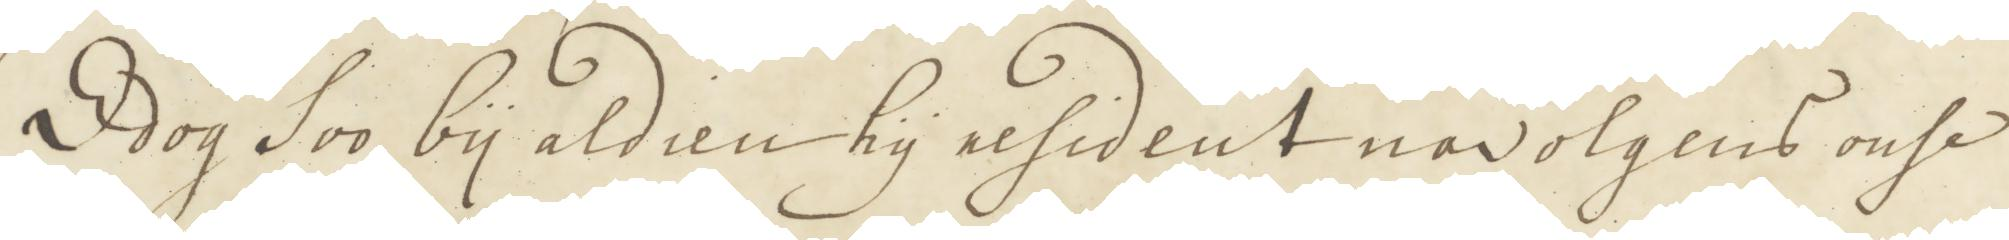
Edog soo bij aldien hij resident navolgens onse
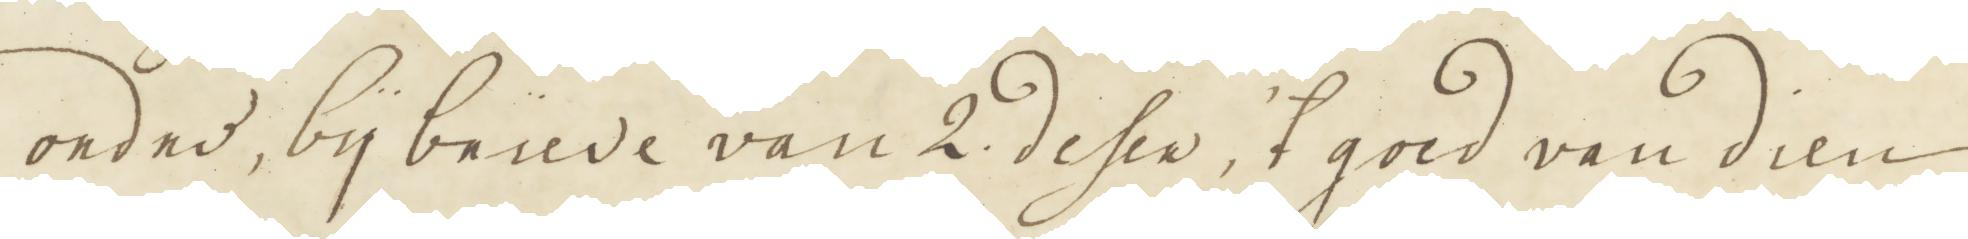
ordre, bij brieve van 2. deser, 't goed van dien
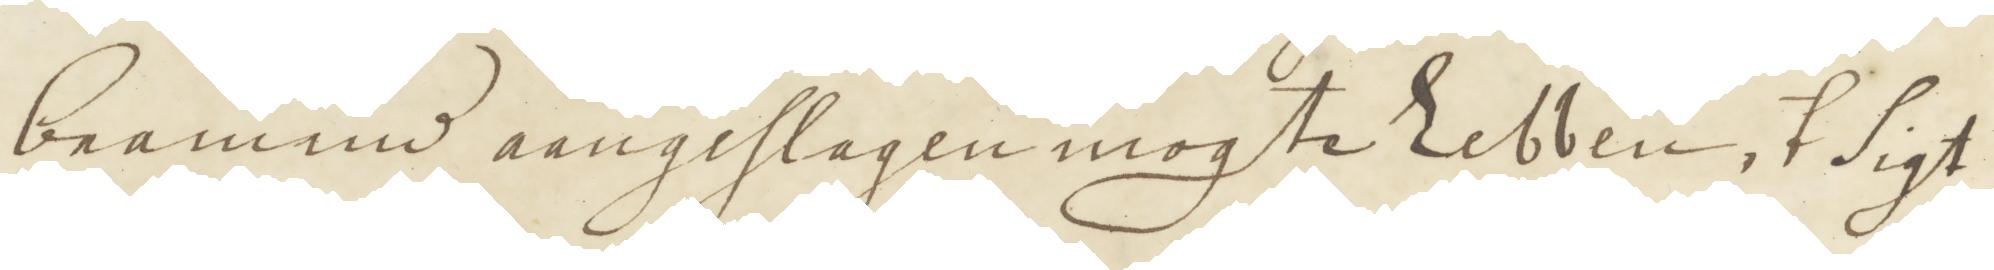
bramine aangeslagen mogte hebben, 't sigt
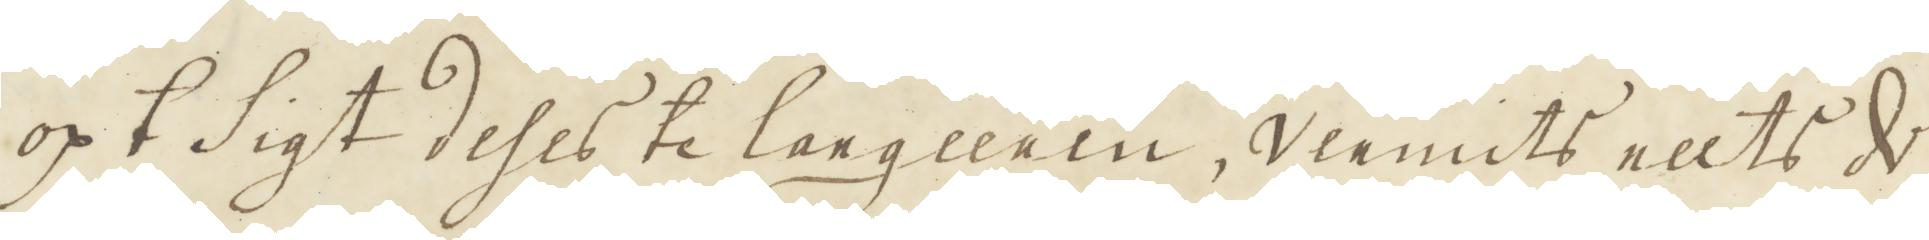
op ’t sigt deses te largeeren, vermits reets de
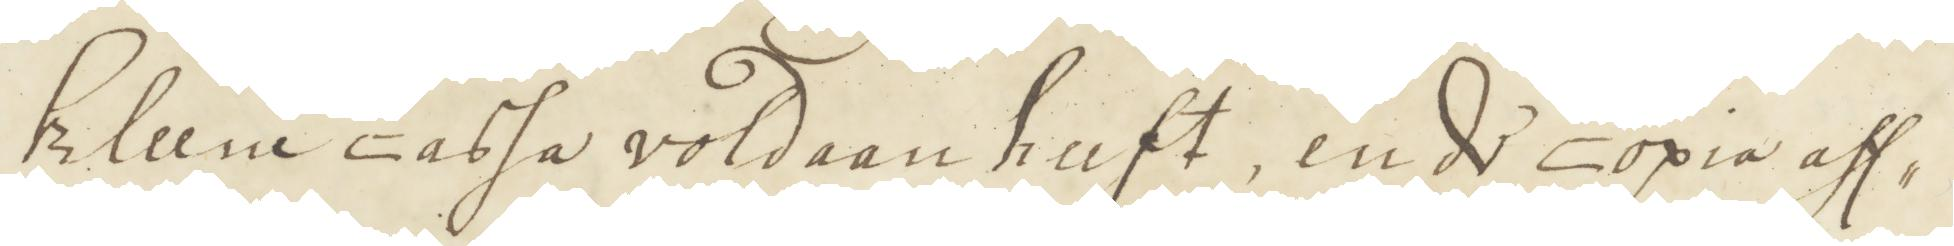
kleene cassa voldaan heeft, en de copia aff„
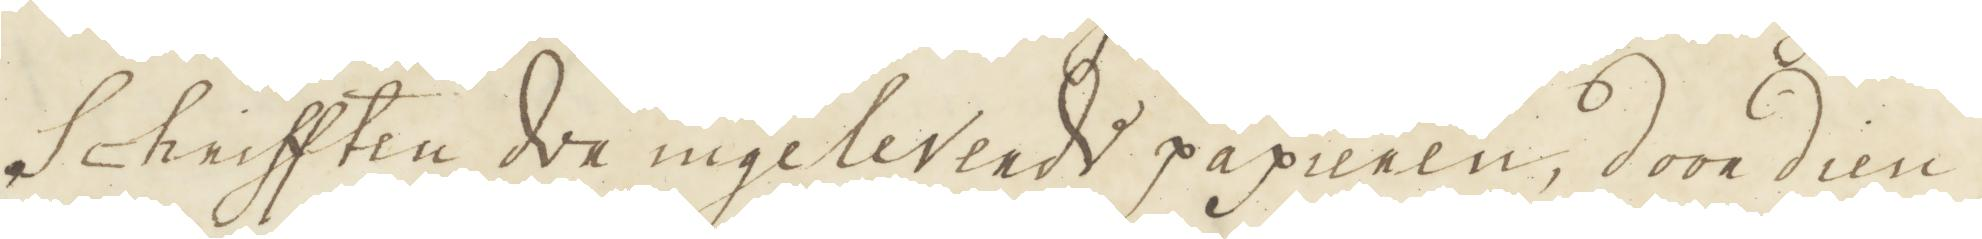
schrifften der ingeleverde papieren, door dien
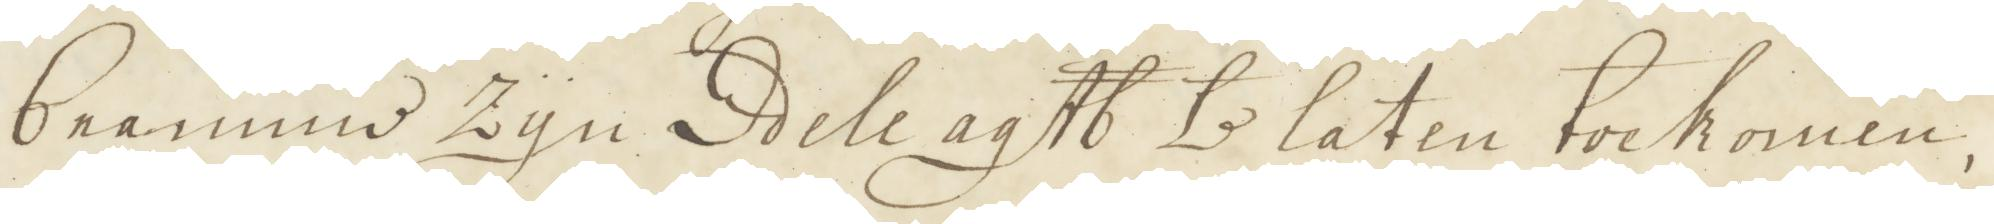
bramine zijn Edele agtb te laten toekomen,
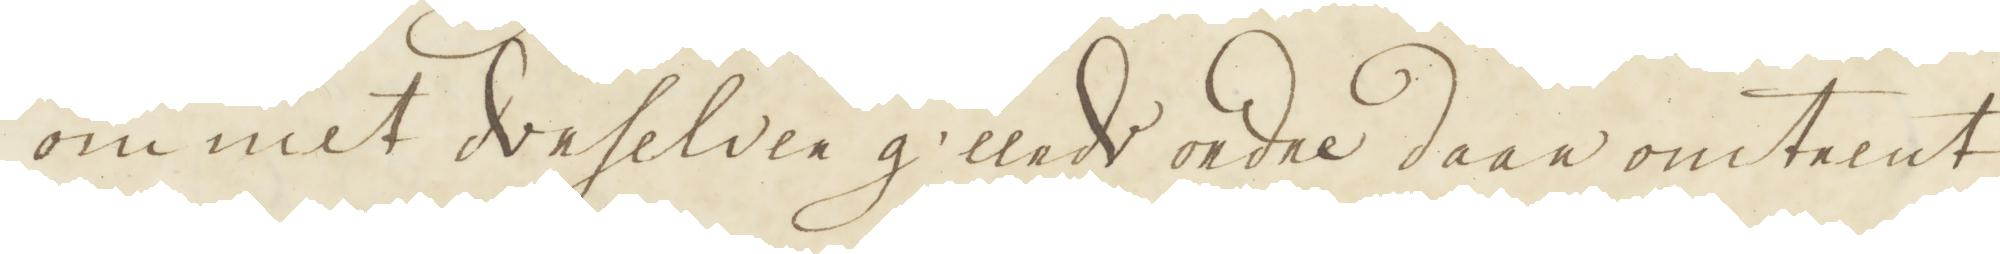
om met derselver g’eerde ordre daar omtrent
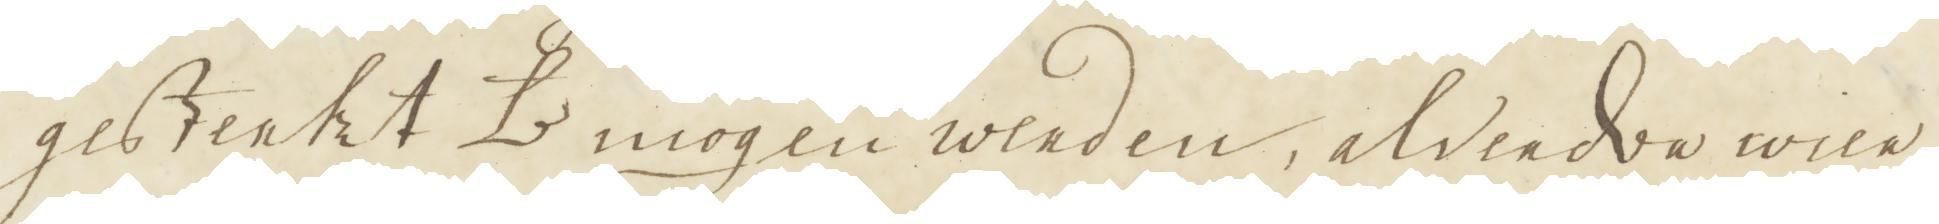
gesterkt te mogen werden, alverder wier
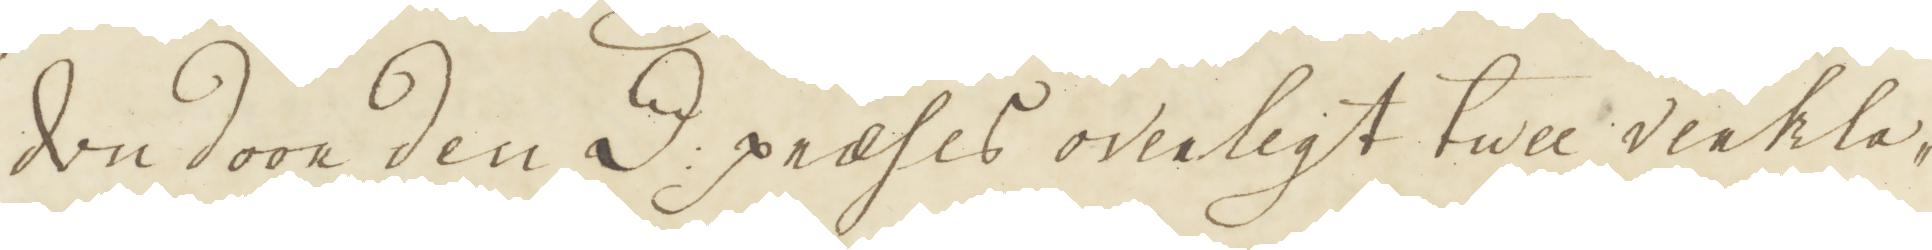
den door den E: praeses overlegt twee verkla
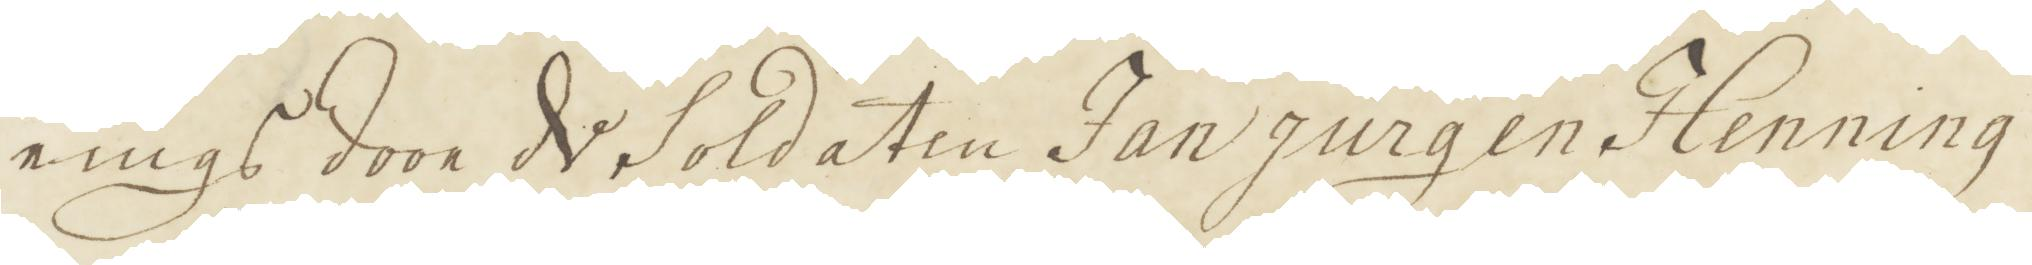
rings door de soldaten Ian jurgen Henning
